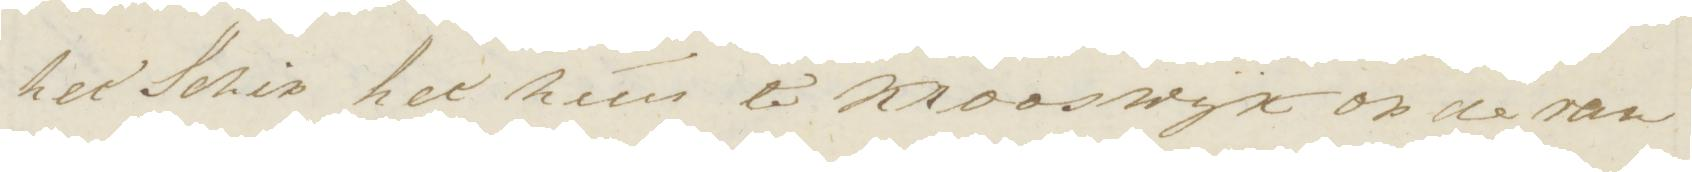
het schip het huis te Krooswijk op de van
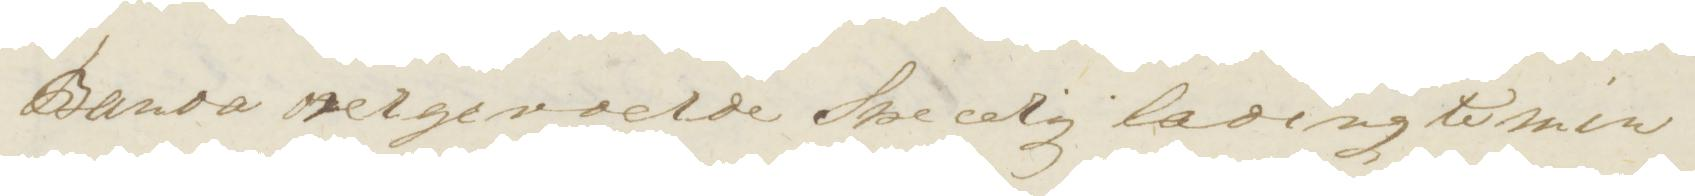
Banda overgevoerde specerij lading te min
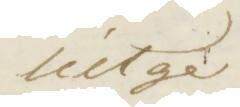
uitge
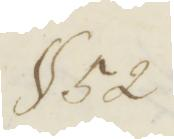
§ 52
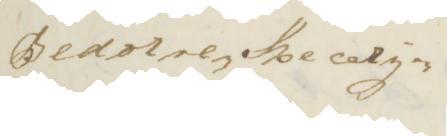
Bedorven specerijen
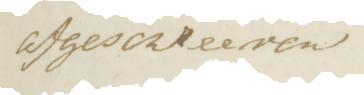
afgeschreeven
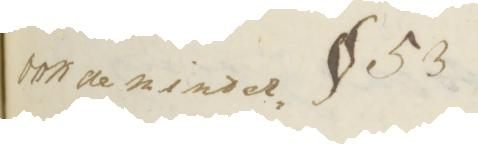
Ook de minder„ §53
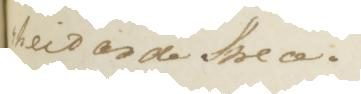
heid op de spece„
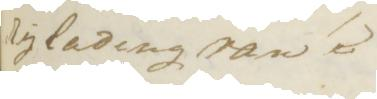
rij lading van ’t
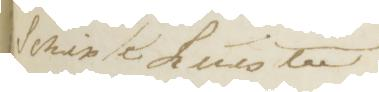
schip 't huis te
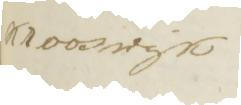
Krooswijk
